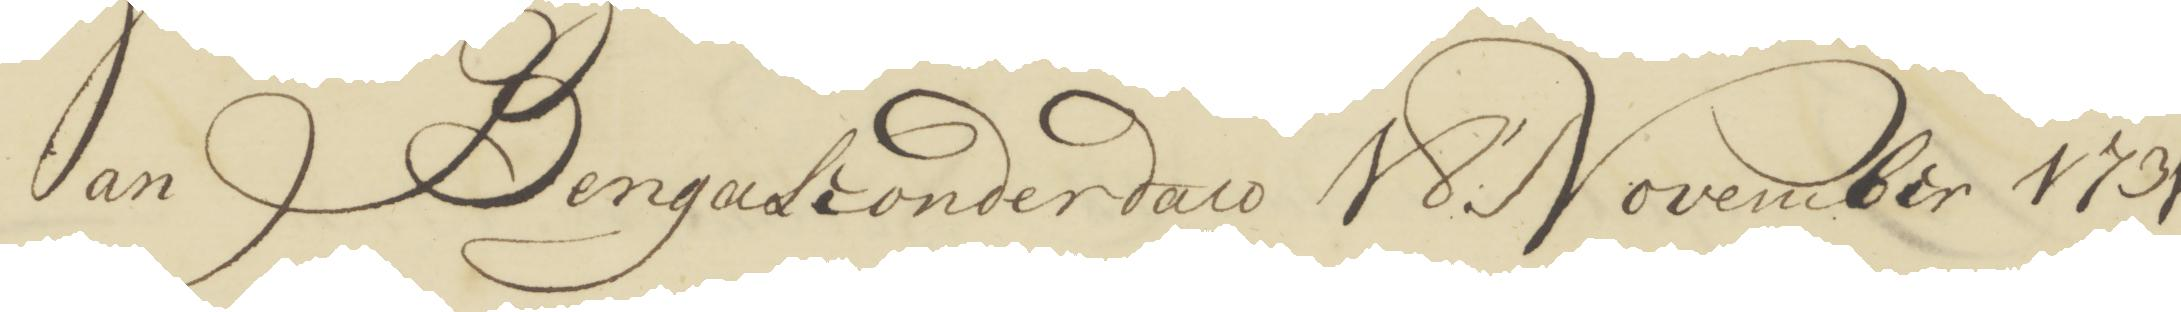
Van Bengale onder dato 18:' November: 1731
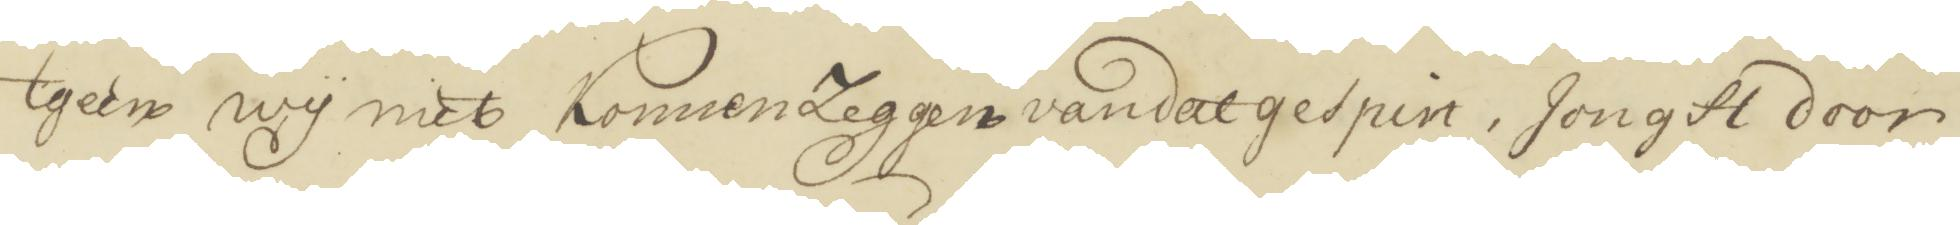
tgeen wij niet konnen zeggen van dat gespin, jongst door
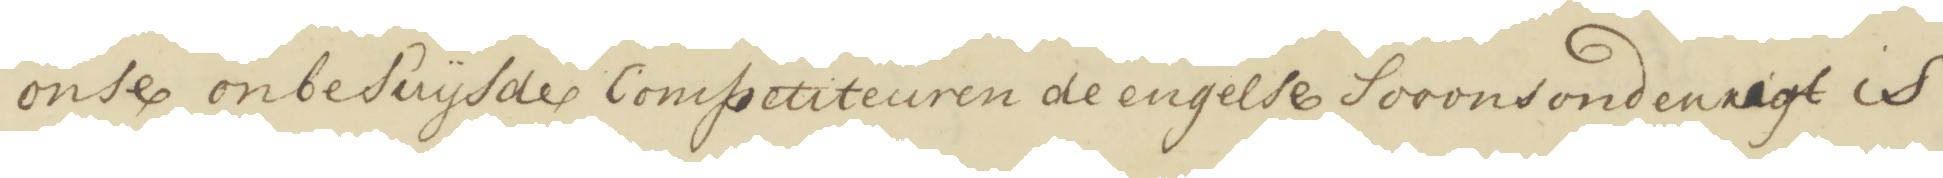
onse onbesuijsde competiteuren de engelse soo ons onderrigt is
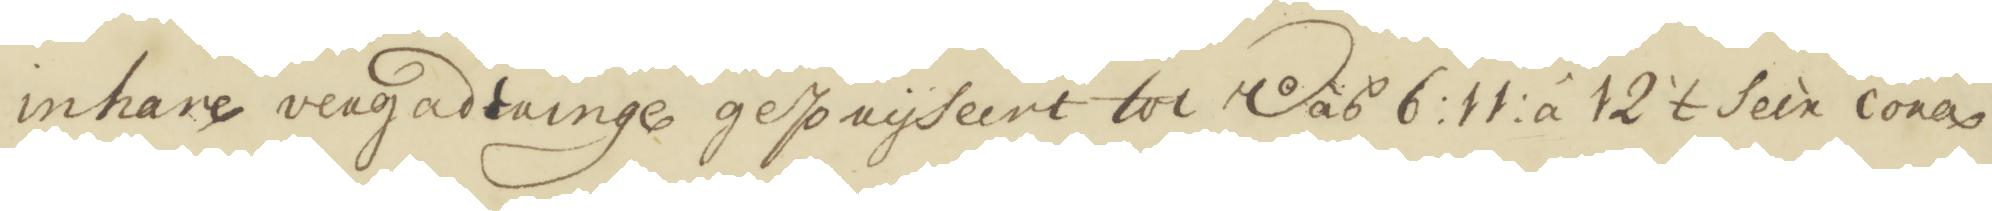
in hare vergaderinge geprijseert tot R o/as 6:11:â 12 ’t seer cora
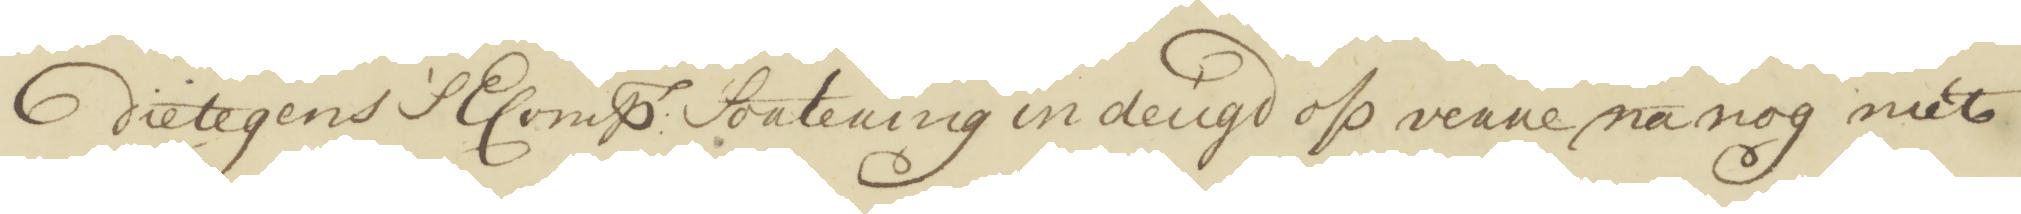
die tegens 's EComp: sortering in deugd op verre na nog niet
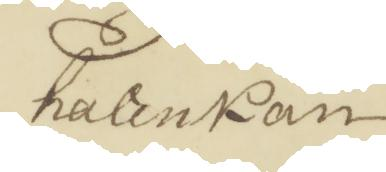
halen kan
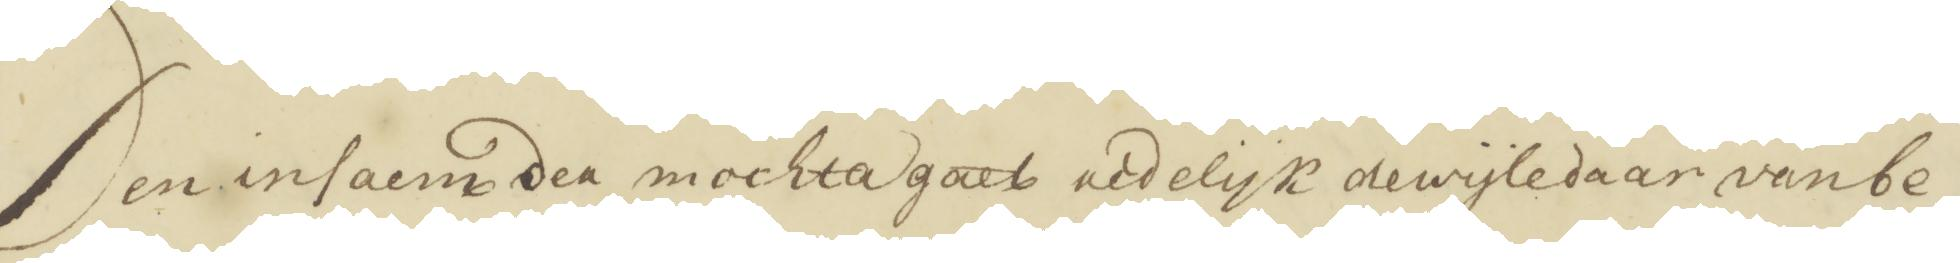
Den insaem der mochta gaet redelijk dewijle daar van be
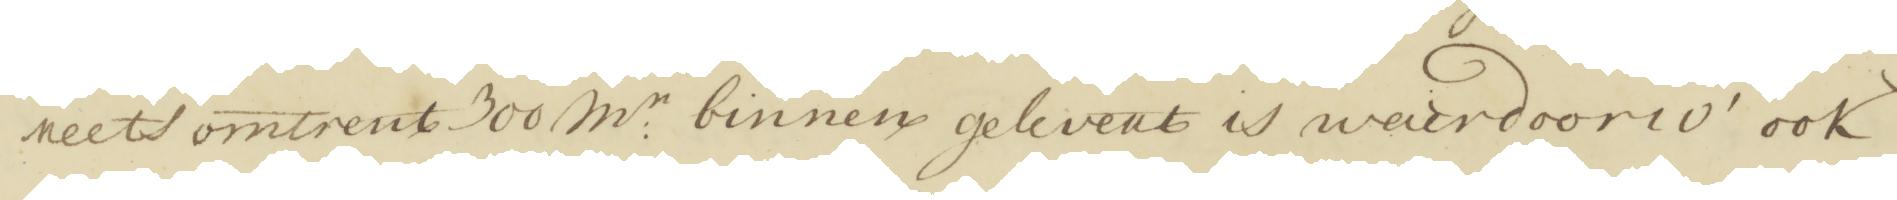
reets omtrent 300 m:r binnen gelevert is waerdoor w' ook
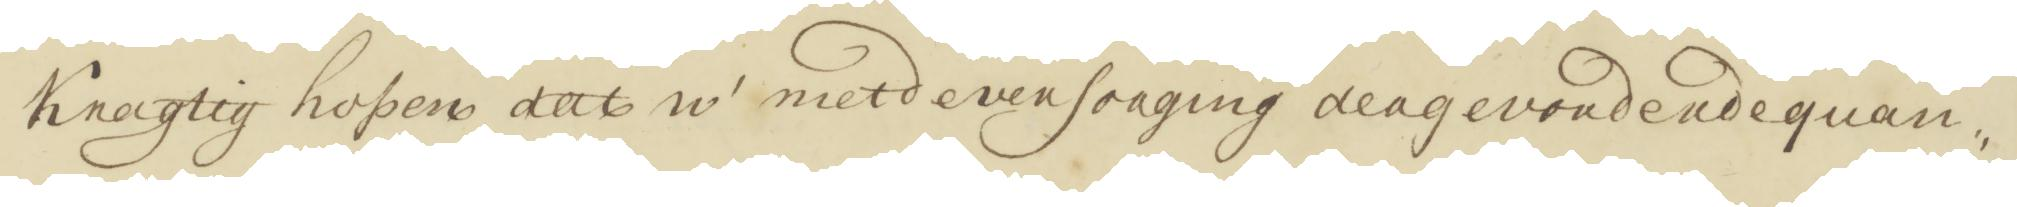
kragtig hopen dat w' met de versorging der gevorderde quan„
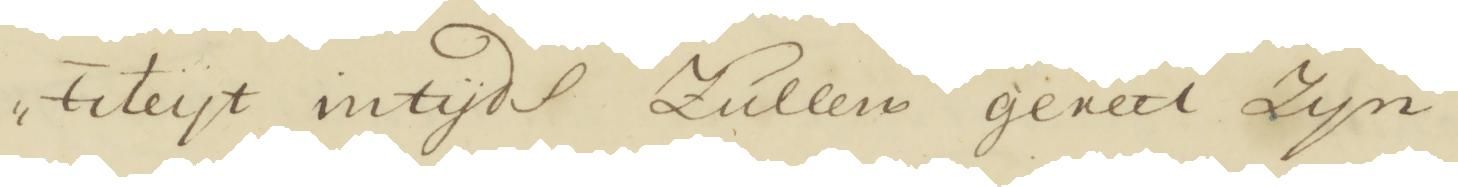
„titeijt intijds zullen gereet zijn
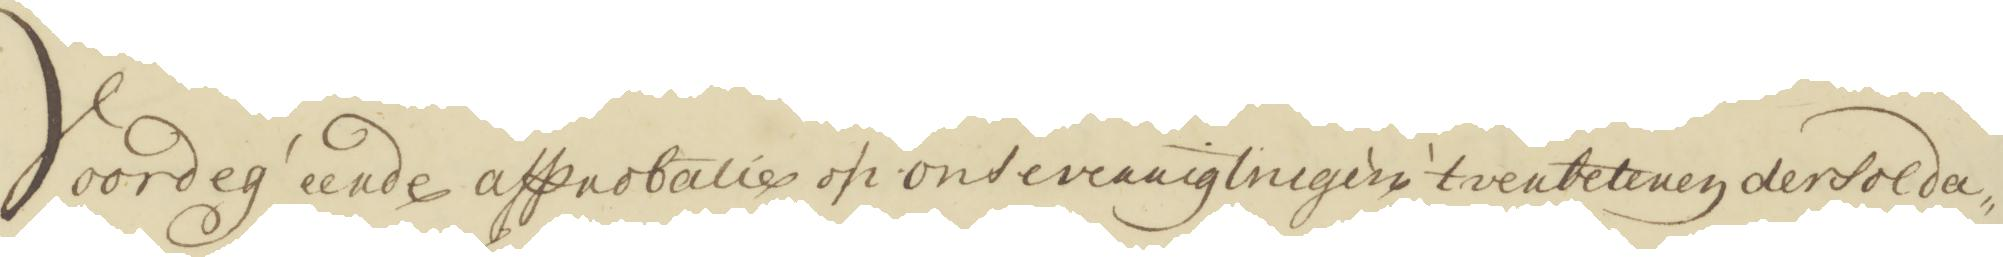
Voor de g’eerde approbatie op onse verrigtingen ’t verbeteren der solda„
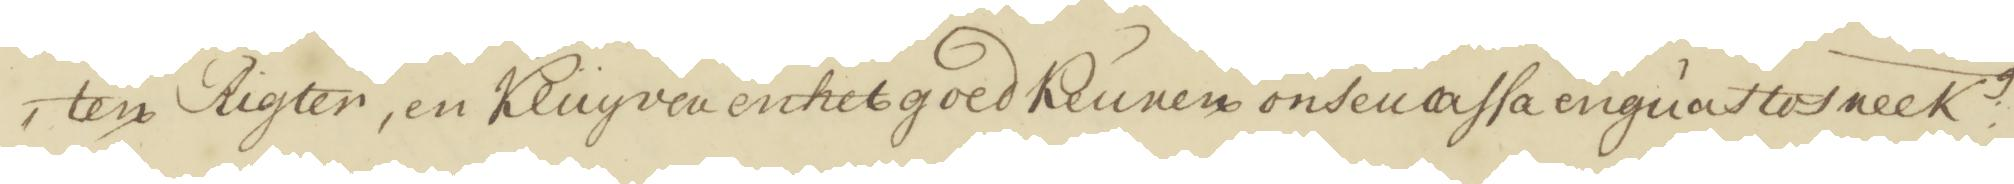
„ten Rigter, en Kluijver en het goed keuren onsen cassa en guastos reek:g
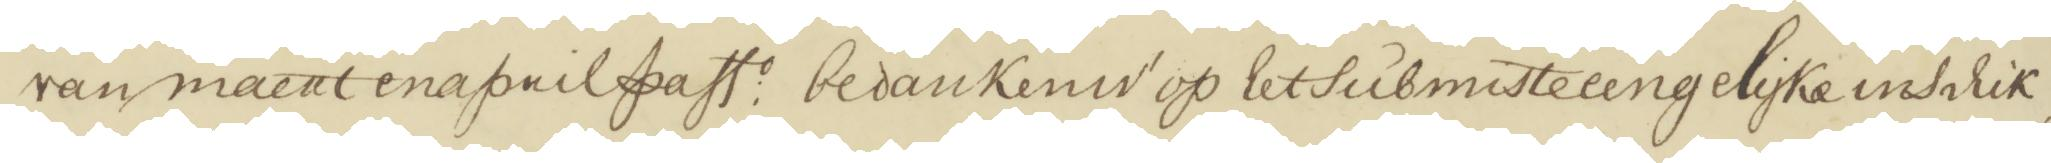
van maert en april pass:o bedanken w' op het submiste een gelijke inschik
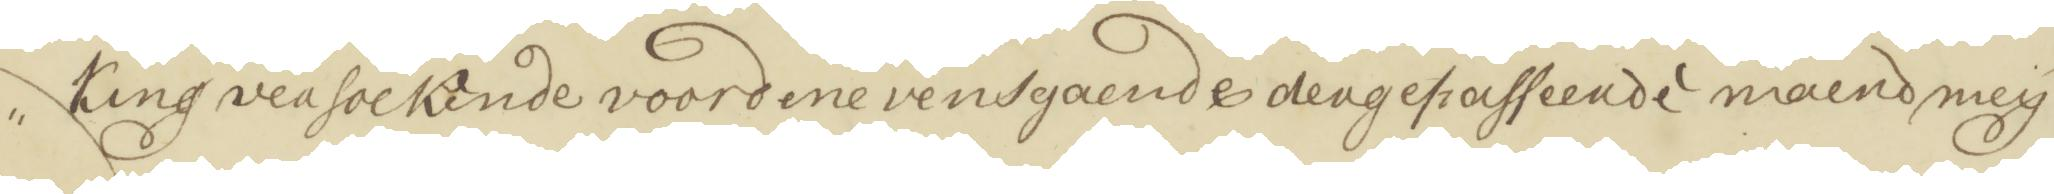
„king versoekende voor de nevensgaende der gepasseerde maend meij
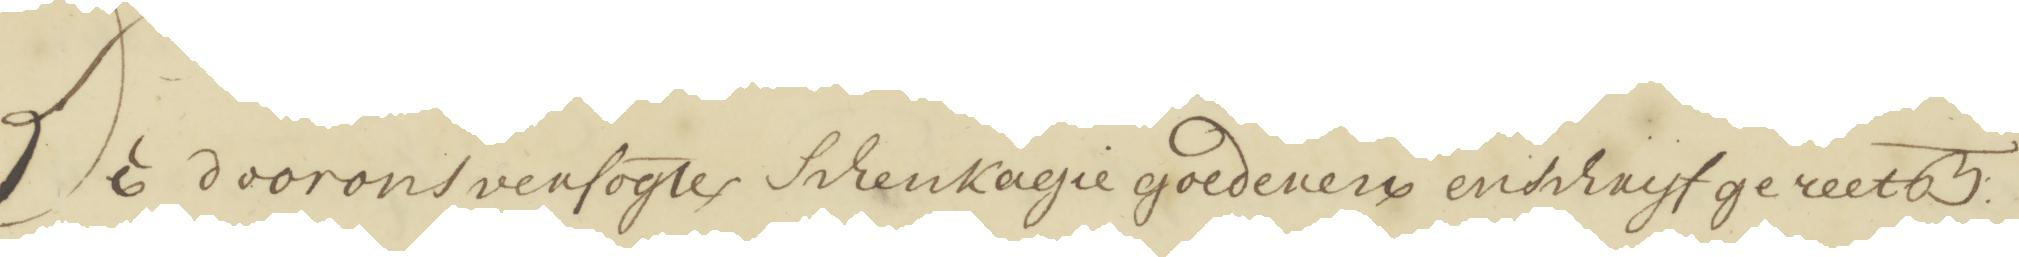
De door ons versogte schenkagie goederen en schrijf gereetsz:
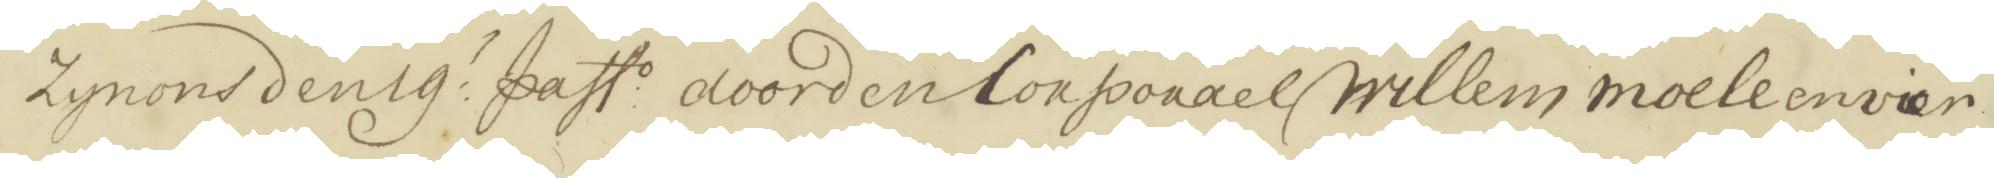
Zijn ons den 19:' pass:o door den Corporael Willem moele en vier
